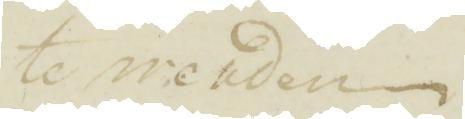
te werden
